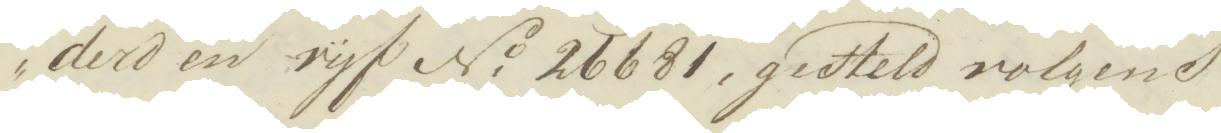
„derd en vijf N,o 26681, gesteld volgens
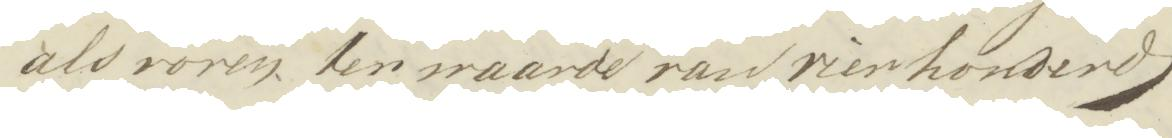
als voren ter waarde van vierhonderd
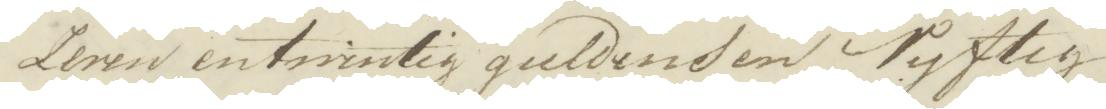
Zeven en twintig guldens en Vyftig
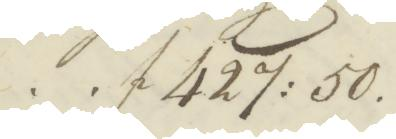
. . ƒ 427: 50.
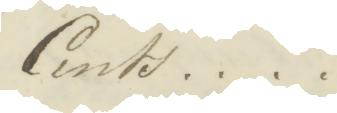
Cents . . . .
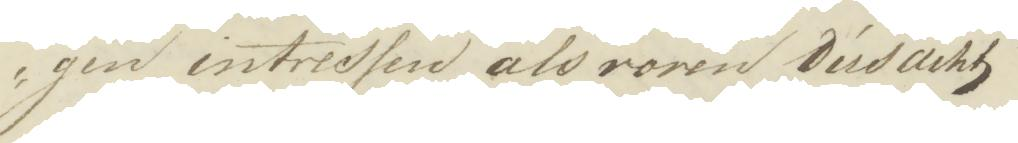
„gen intressen als voren, dus acht
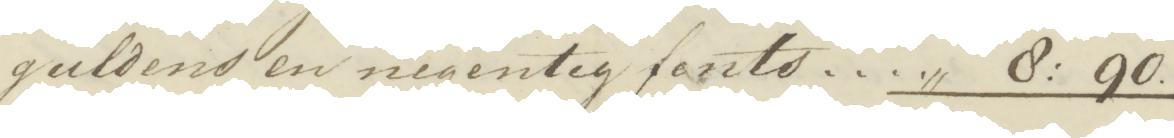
guldens en negentig Cents . . . .„ 8: 90.
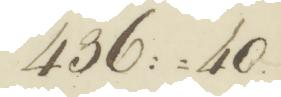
436: :40
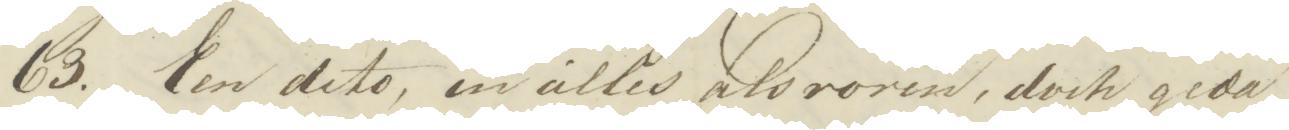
63. Een dito, in alles als voren, doch geda
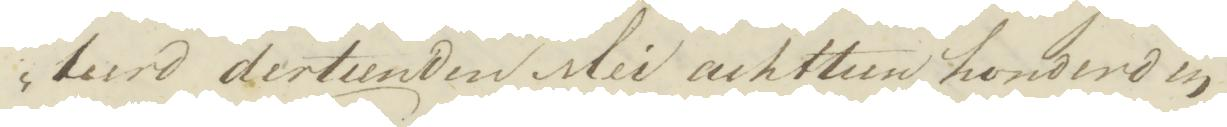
„teerd dertienden Mei achttien honderd en
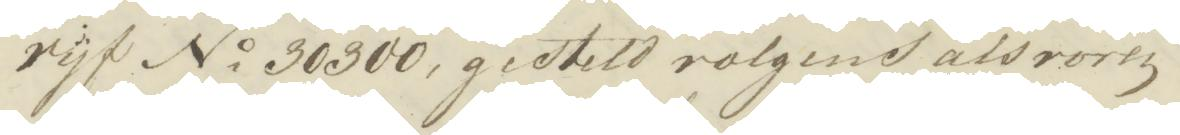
vijf N„o 30300, gesteld volgens als voren
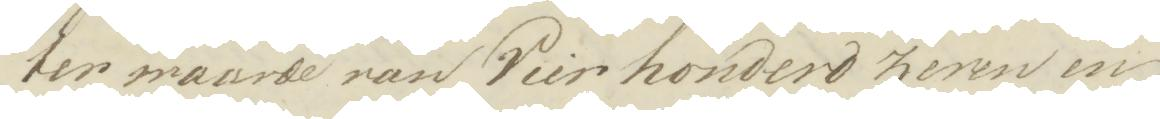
ter waarde van Vierhonderd zeven en
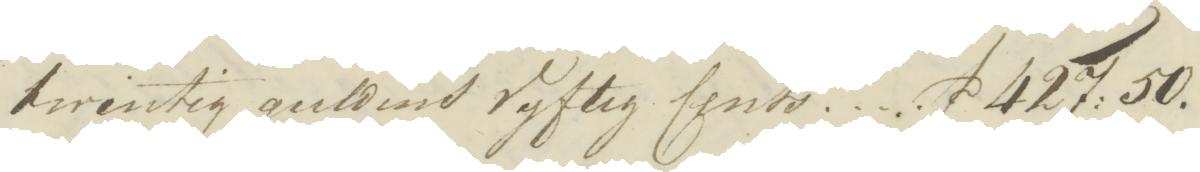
twintig guldens Vyftig Cents . . . . .ƒ 427: 50.
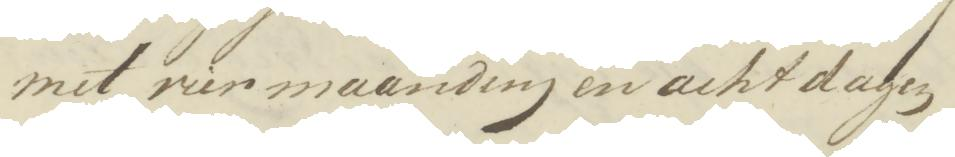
met vier maanden en acht dagen
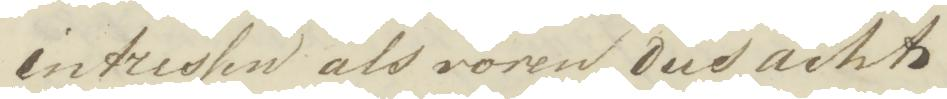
intressen als voren, dus acht
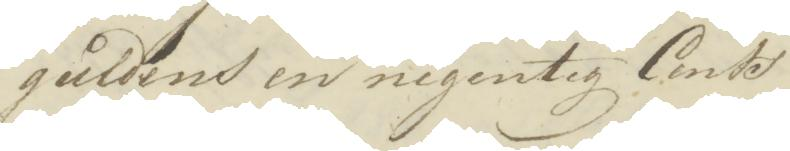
guldens en negentig Cents
